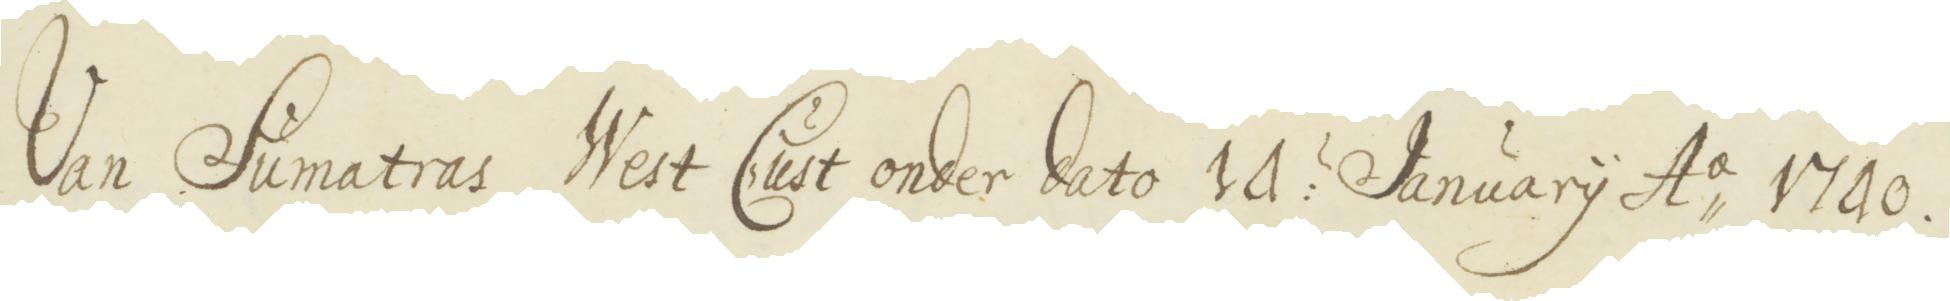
Van Sumatras West Cust onder dato 14:' Ianuarij A„o 1740.
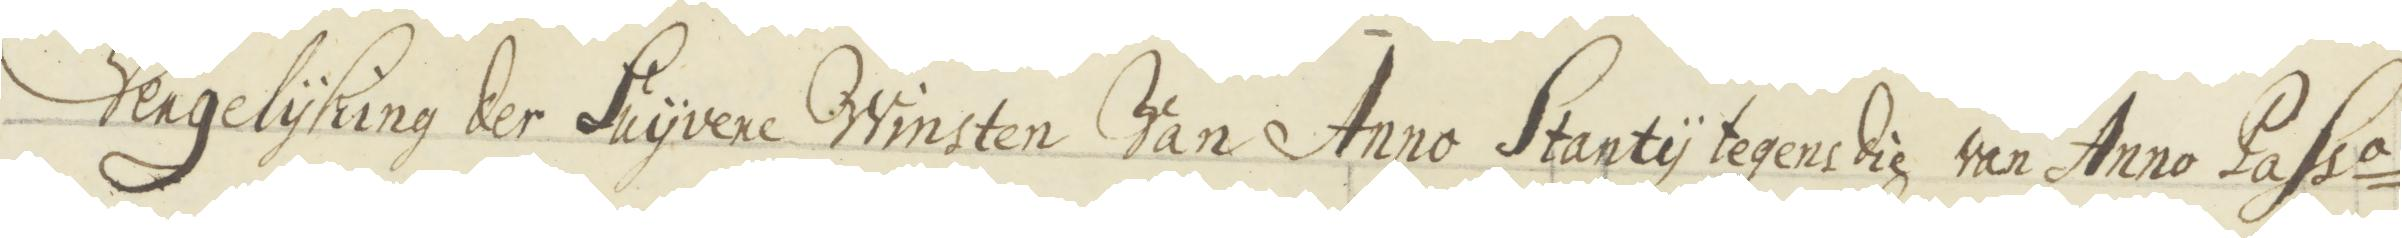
Vergelijking der Suijvere winsten van Anno Stantij tegens die van Anno Pass=o
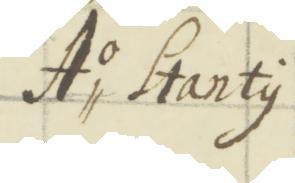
A„o Stantij
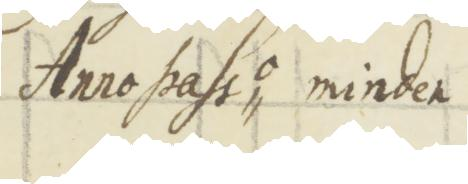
Arno pass„o minder
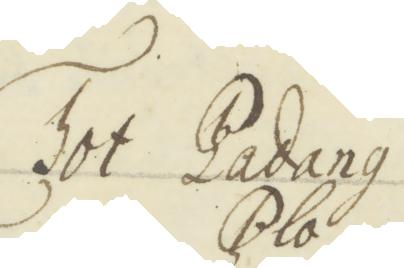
Tot Padang
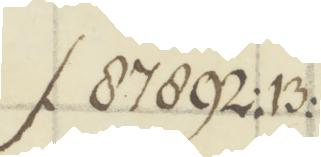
ƒ 87892:13:_
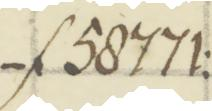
ƒ58771:16:_
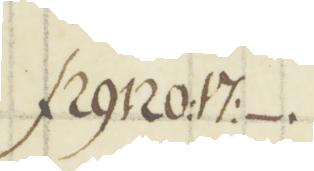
ƒ29120:17:_.
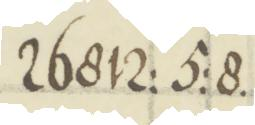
26812:5:8.
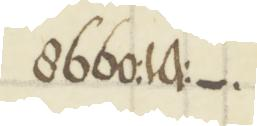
8660:14:_.
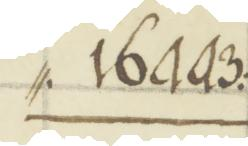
„ 1644:3:2:_„.
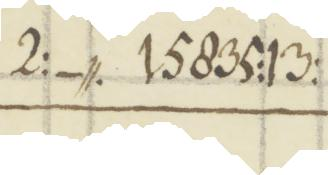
15835:13:8.
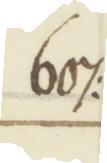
607:
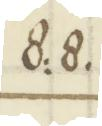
8:8.
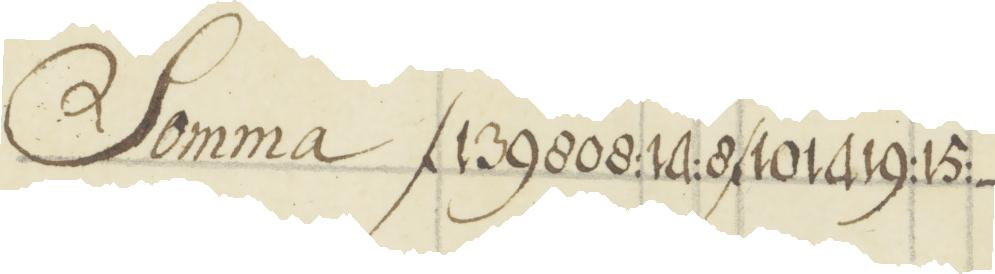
Somma ƒ139808:14:8 ƒ101419:15:
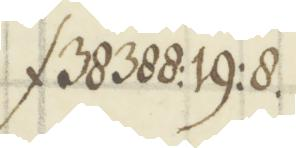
ƒ38388:19:8.
